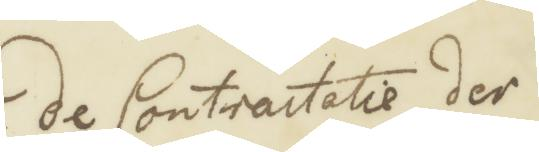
de Contractatie der
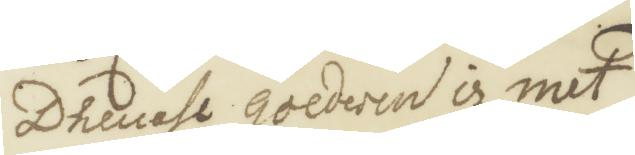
Dhenase goederen is met
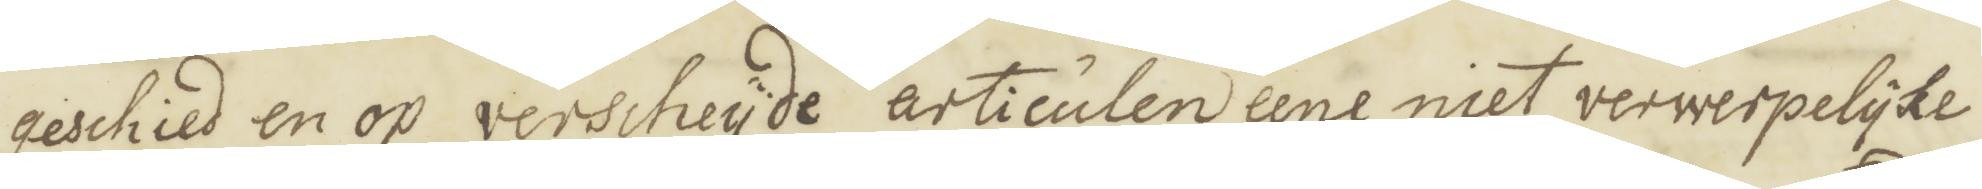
geschied en op verscheijde articulen eene niet verwerpelijke
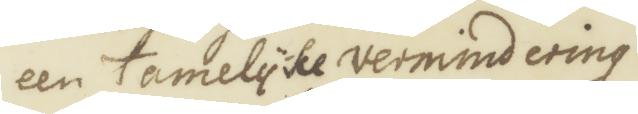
een tamelijke vermindering
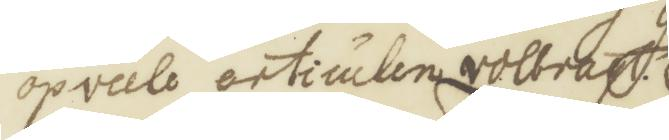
op veele articulen volbragt.
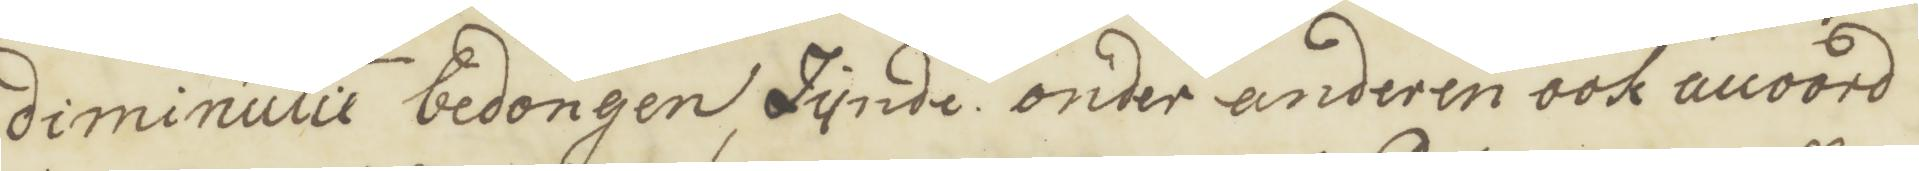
diminutie bedongen zijnde onder anderen ook acoord
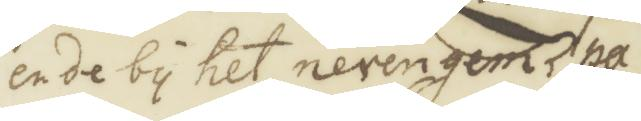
en de bij het nevengem: pa
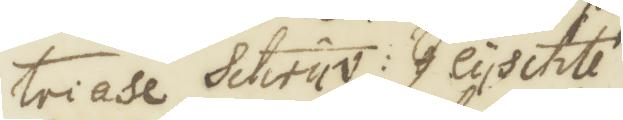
triase schrijv: g eijschte
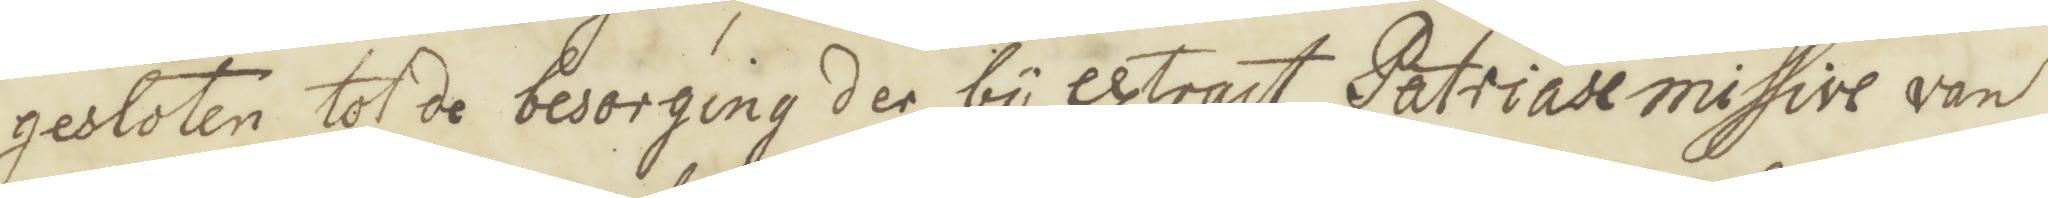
gesloten tot de besorging der bij extract Patriase missive van
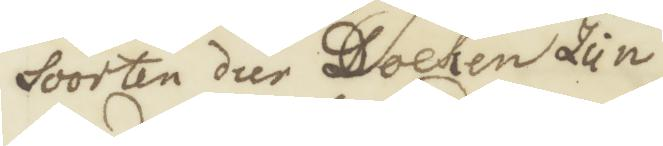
soorten dier Doeken zijn
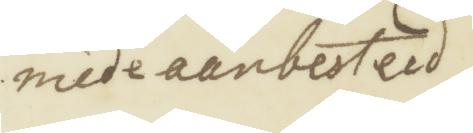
mede aanbesteed
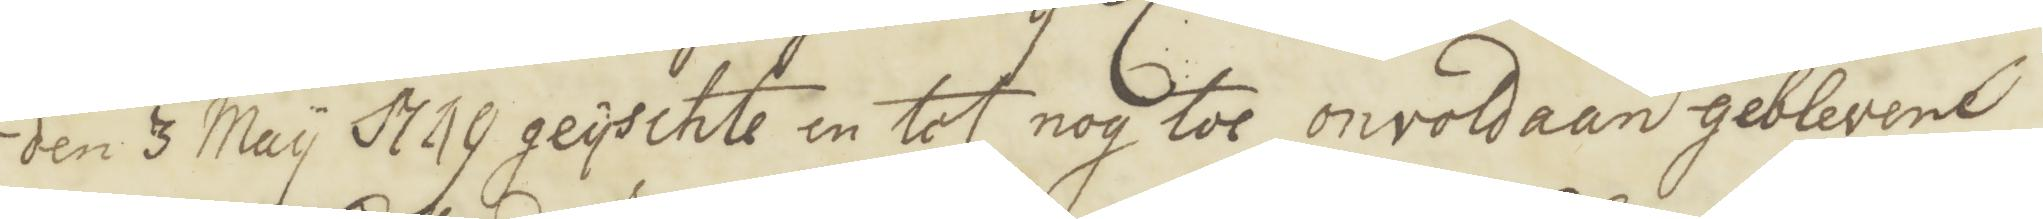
den 3 Maij 1749 geijschte in tot nog toe onvoldaan geblevene
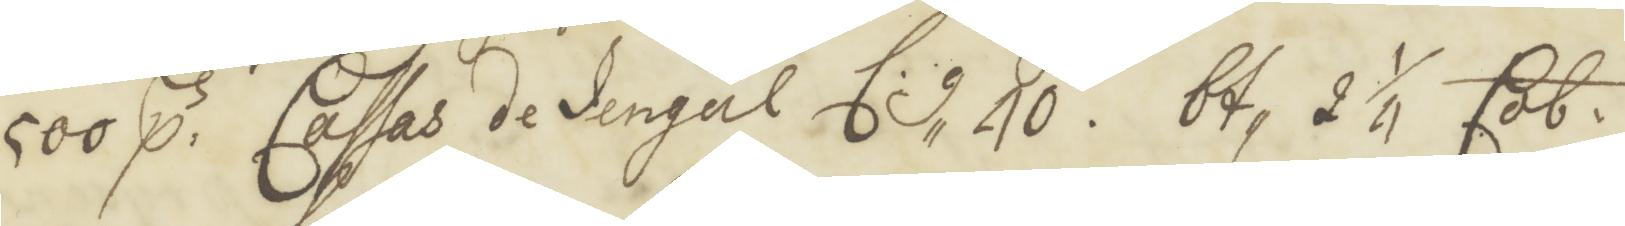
500 p:s Cassas de Sengul C„g 40. bt„ 2¼ Cob:
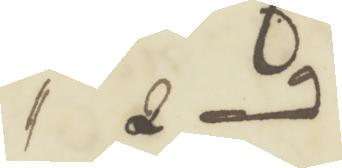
„ 2 _o
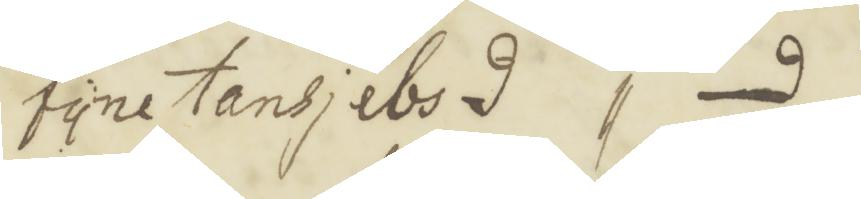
fijne tansjebs d „ _o
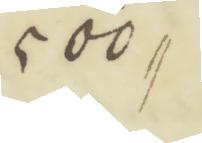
500 „
